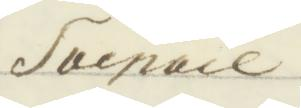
Toepoel
